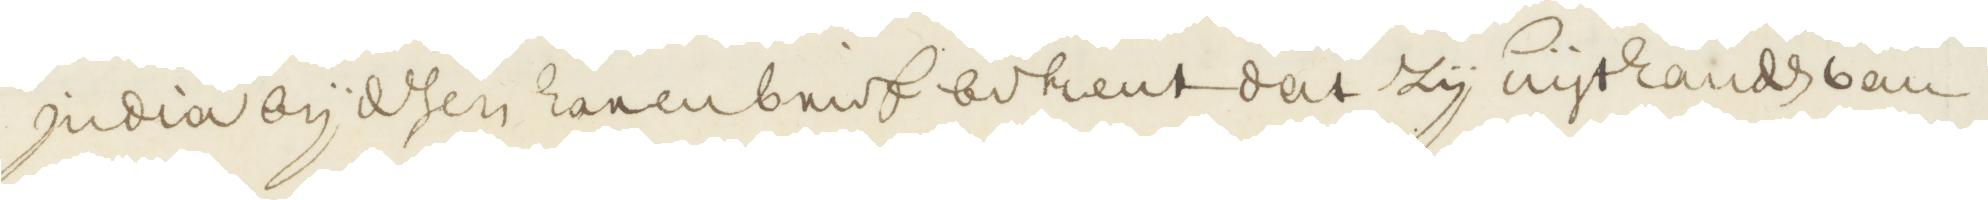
jndia bij desen haren brief bekent dat zij uijt handen van
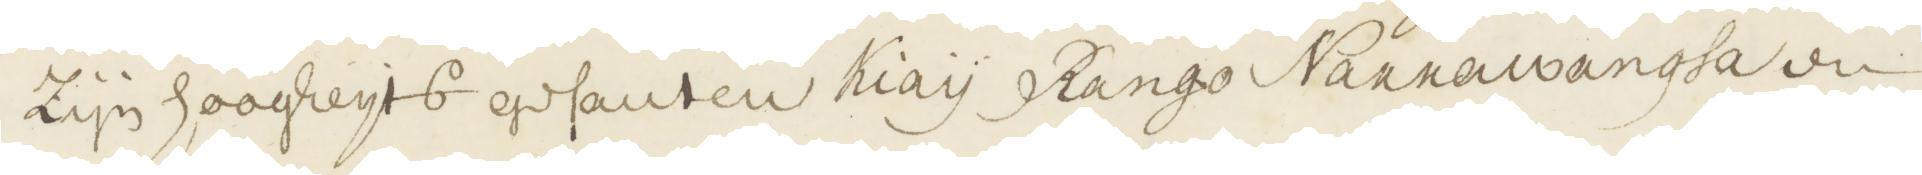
zijn hoogheijts gesanten Kiaij Rango Narrawangsa en
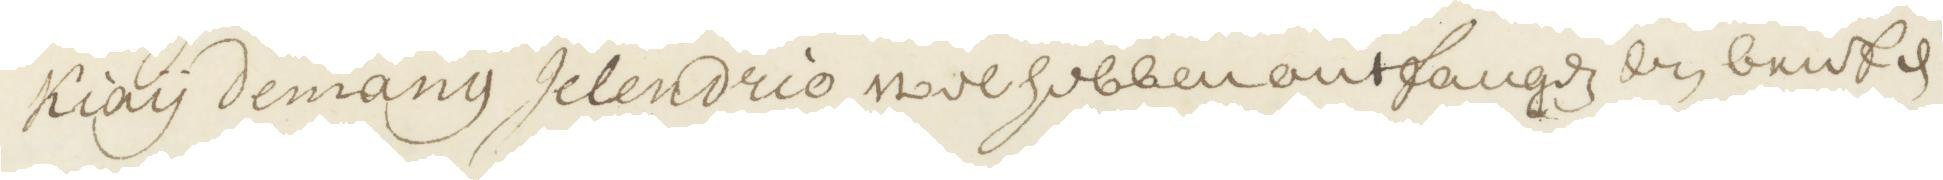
Kiaij demang Jelendrio wel hebben ontfangen den brief en
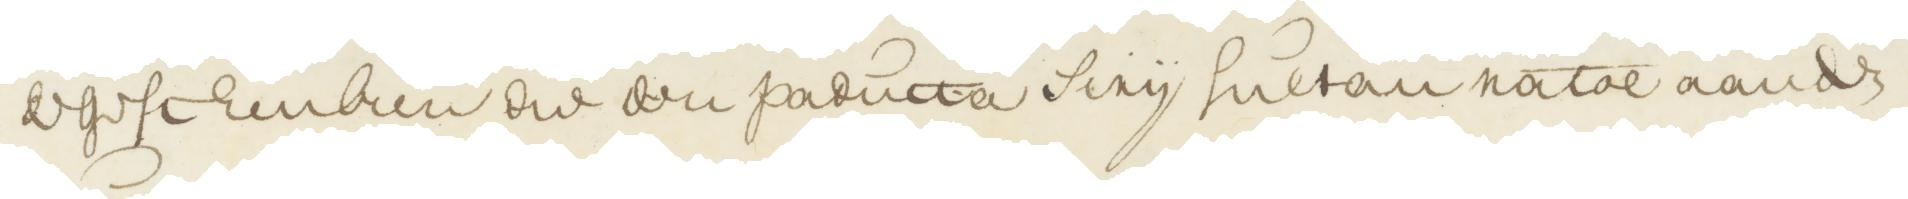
de geschenken die den paducca Sirij sultan ratoe aan den
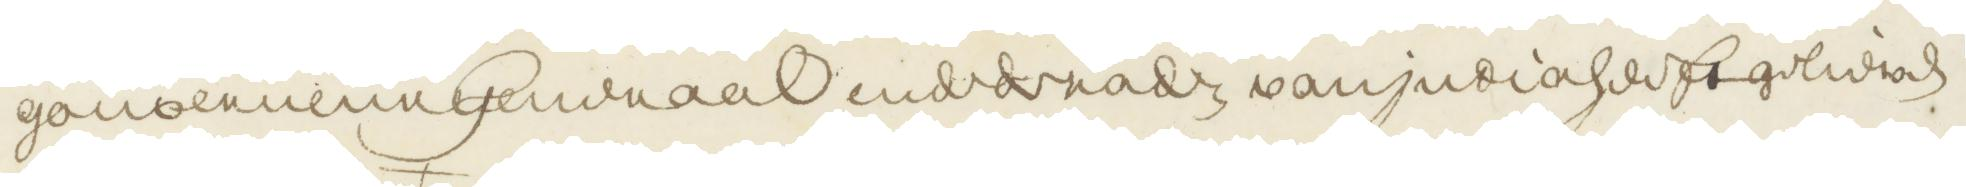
gouverneur Generaal ende de raden van jndia heeft gelieven
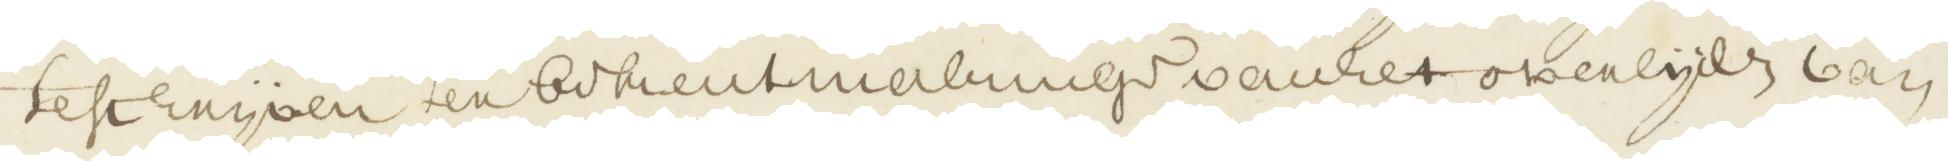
te schrijven ter bekentmakinge van het overlijden van
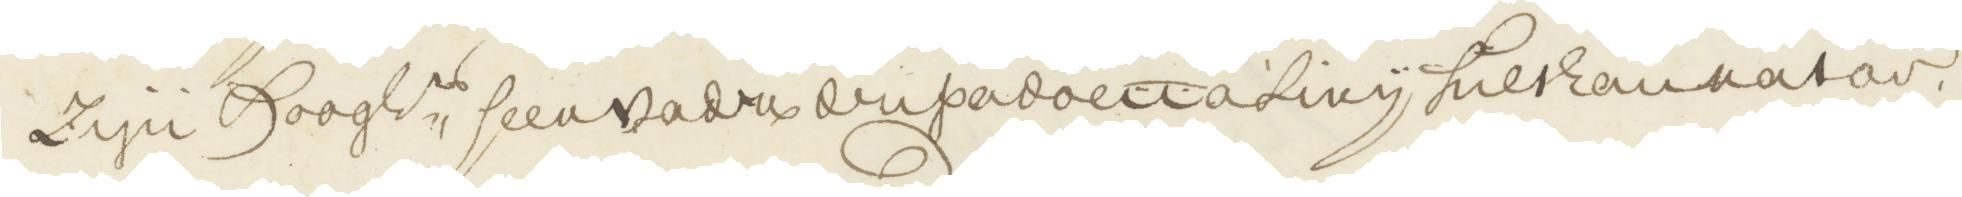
Zijn Hoogh„ts heer vader den padoecca Sirij sulthan ratoe,
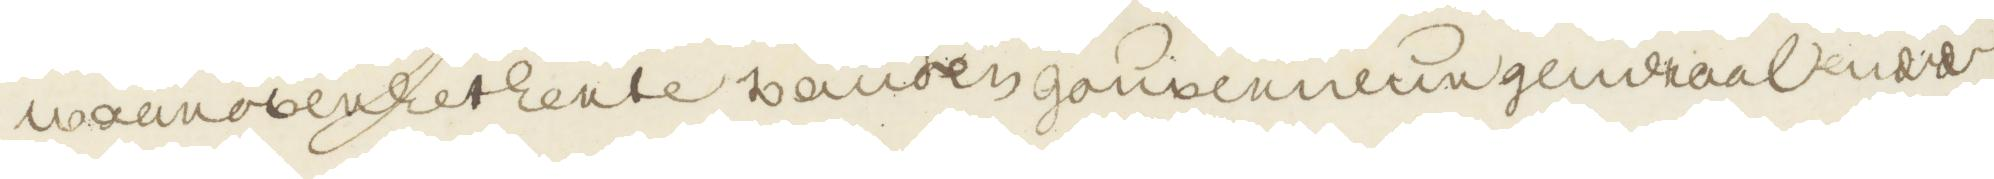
waar over het herte vanden gouverneur generaal ende de
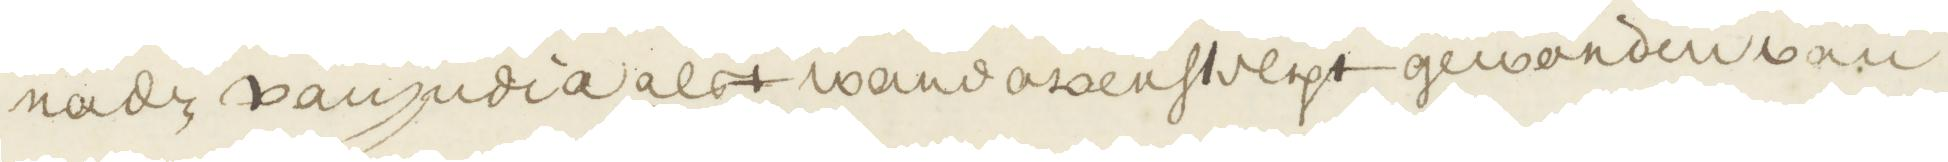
raden van jndia als t ware overstelpt geworden van
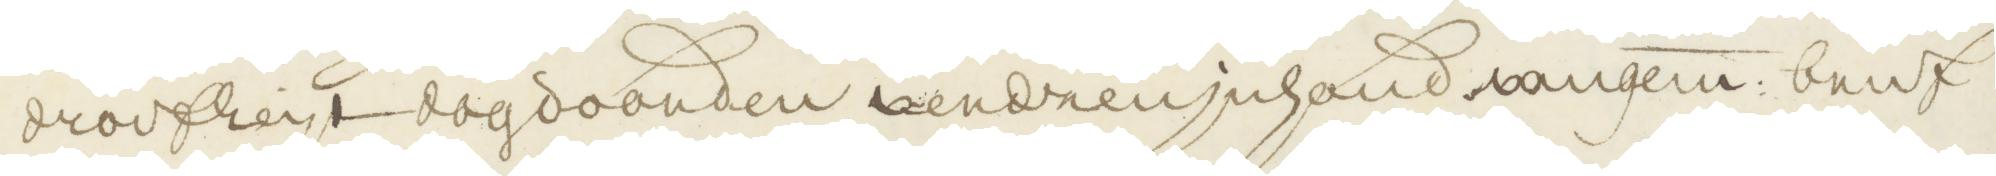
droefheijt dog door den verderen jnhoud van gem: brief
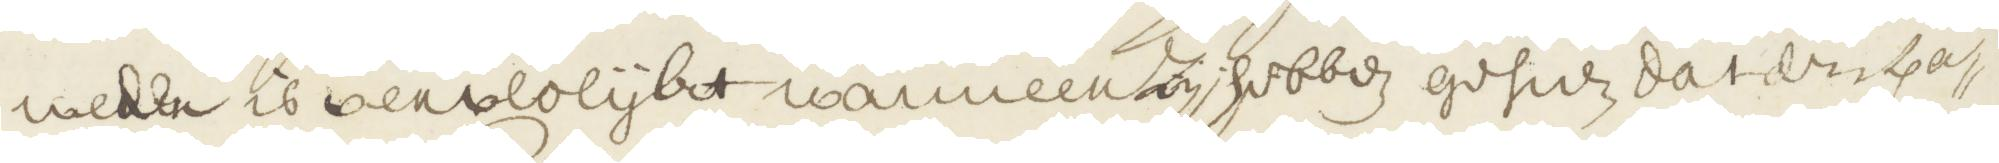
weder is vervlolijkt wanneer Zij hebben gesien dat den pa„
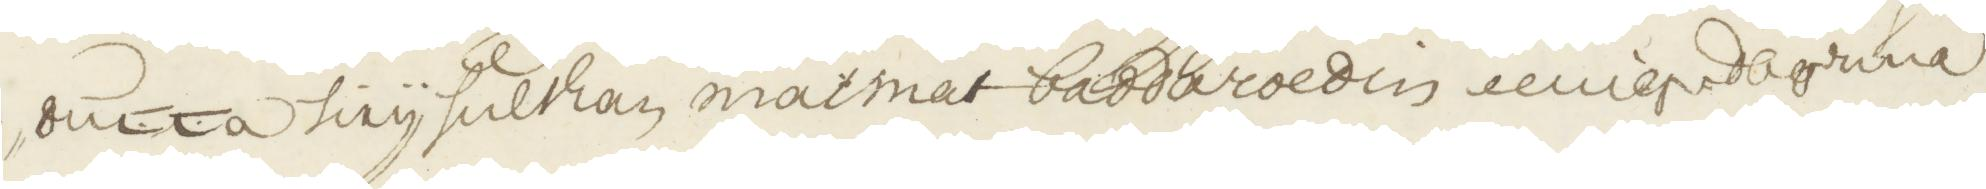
„ducca Sirij sulthan macmat baddaroedin eenige dagen na
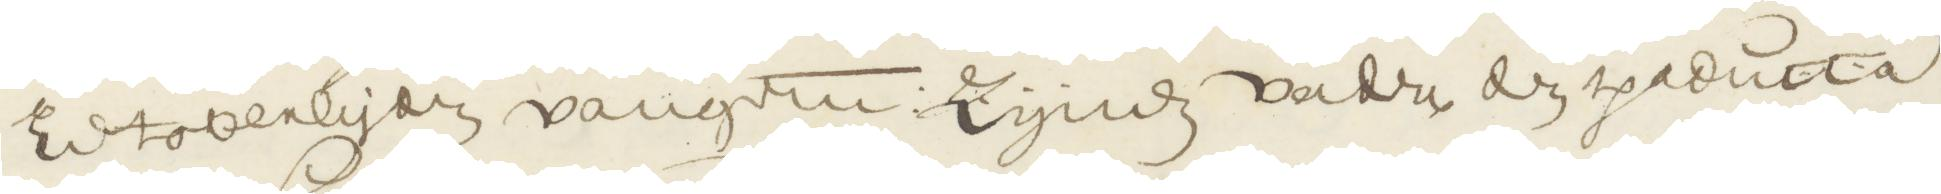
het overlijden van gem: Zijnen vader den paducca
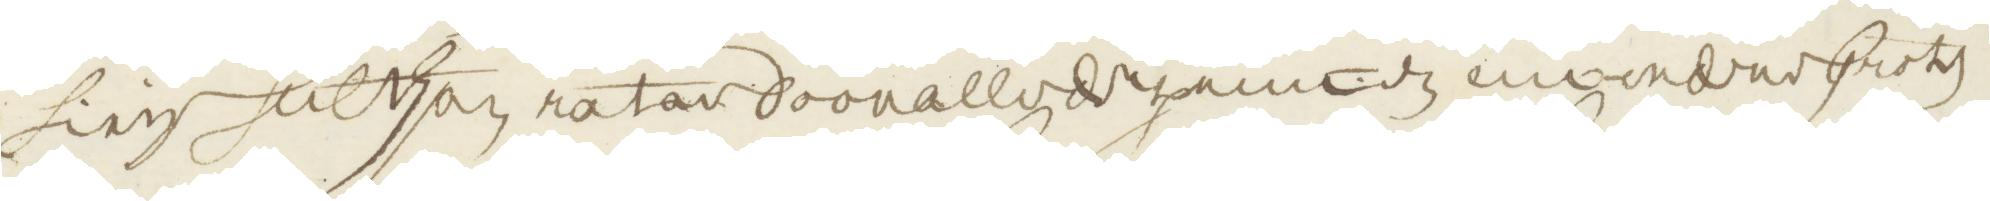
Sirij sulthan ratoe door alle de princen en verdere Groten
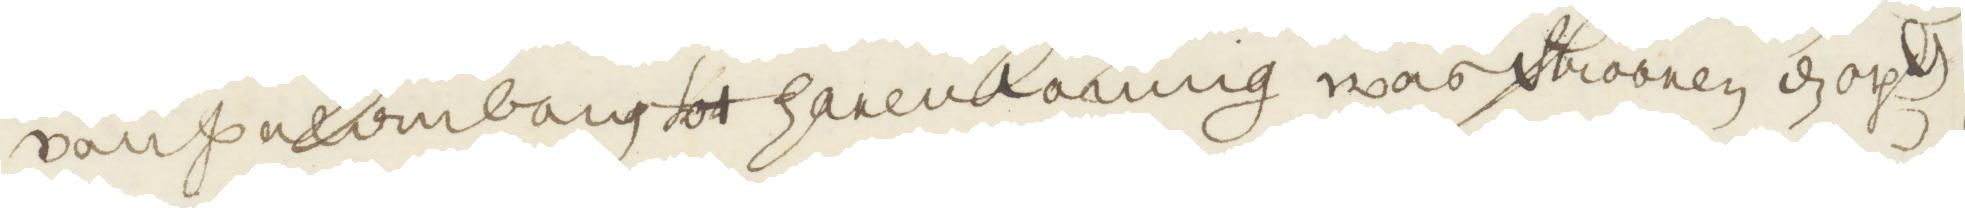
van palembang tot haren Koning was verkooren en op den
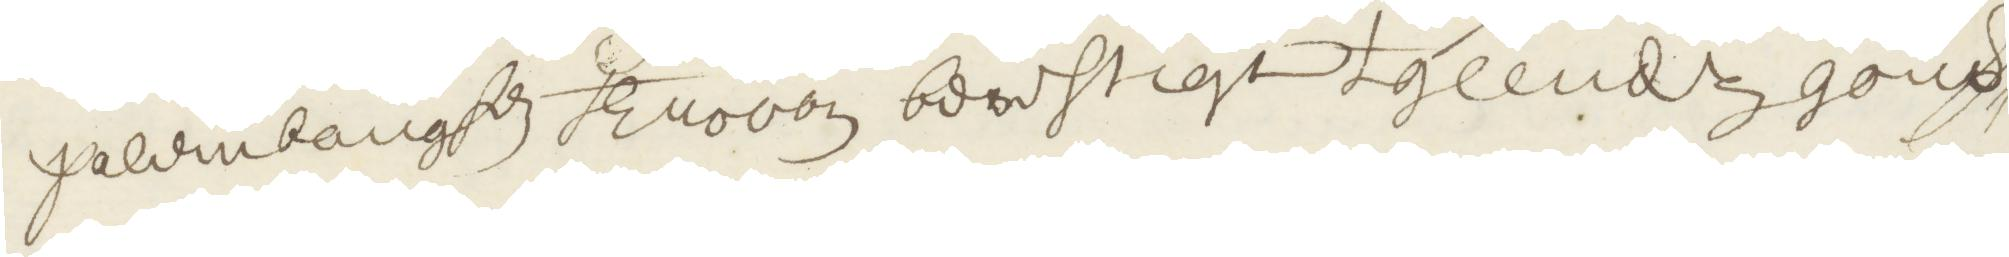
palembangse throon bevestigt t geen de gouver„
